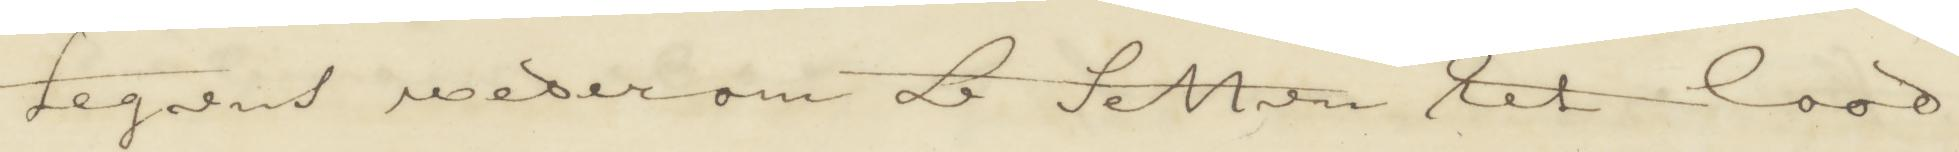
tegens wederom te setten het lood
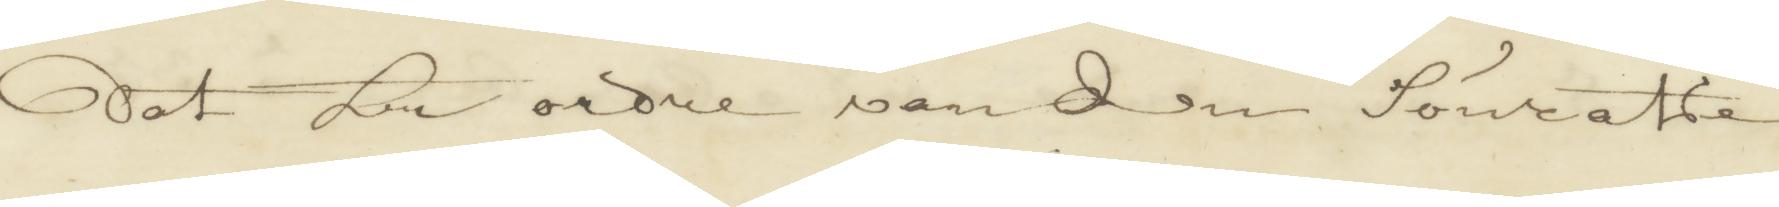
dat ter ordre van den souratse
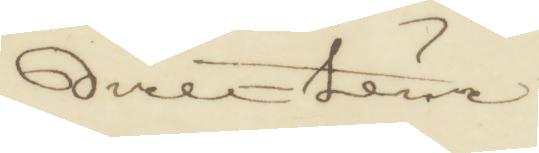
directeur
